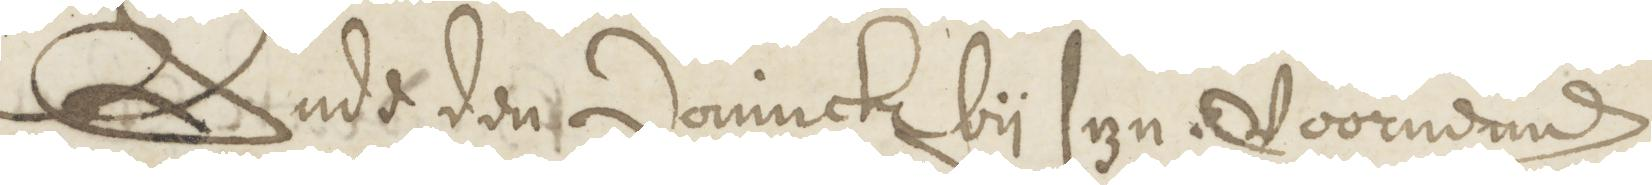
Ende den Coninck bij syn voornemen
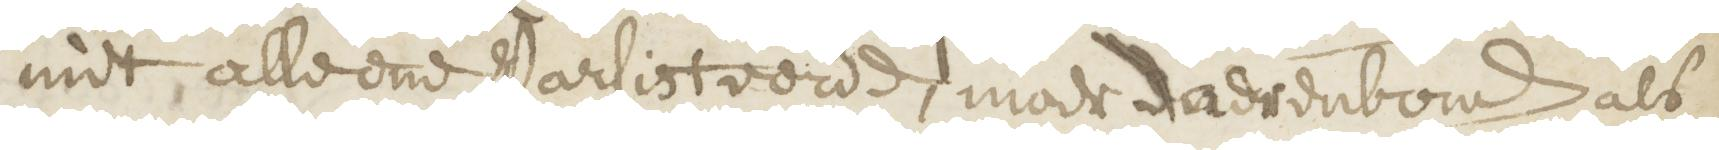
niet alleene Parsisteerde, maer daerenboven als
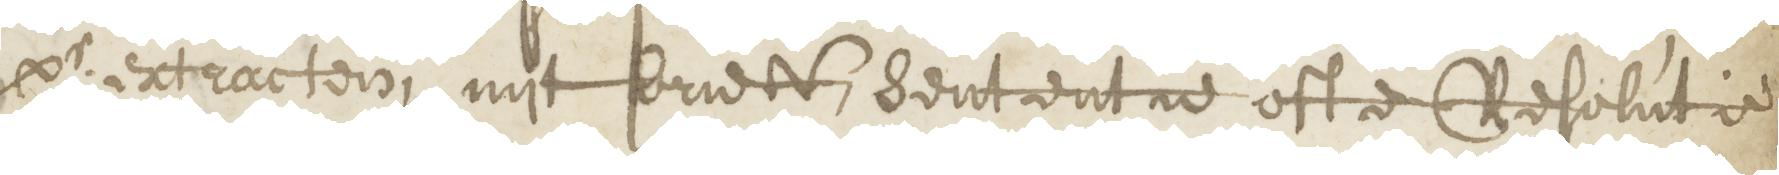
p:r extracten, uyt brieff, sententie ofte Resolutie
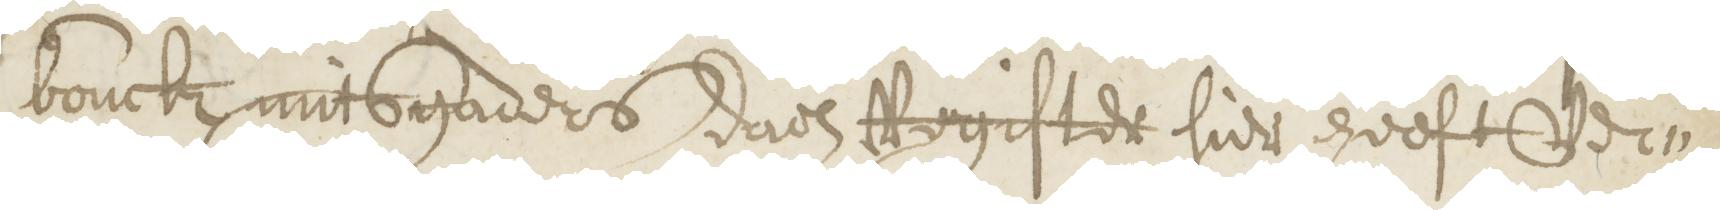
bouck mitsgaders dach Register hier heeft ver„
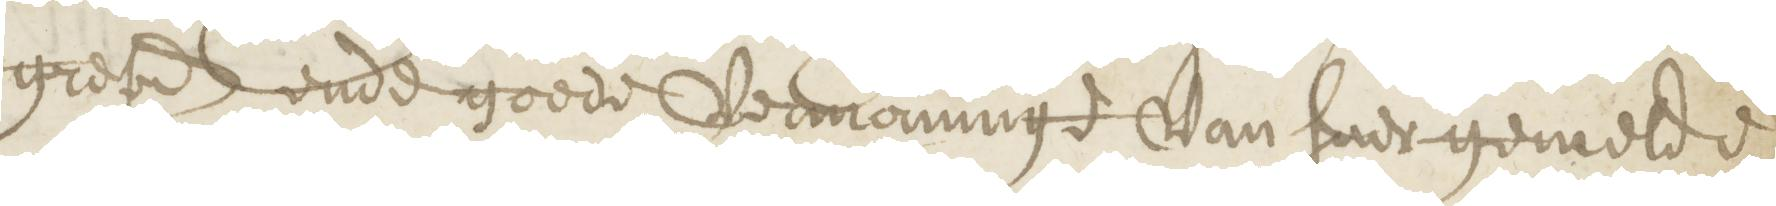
grepen ende goede vermaninge van haer gemelde
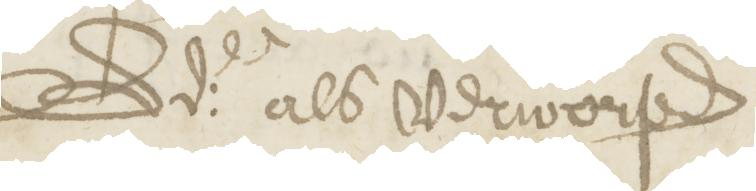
Ed:e als verworpen
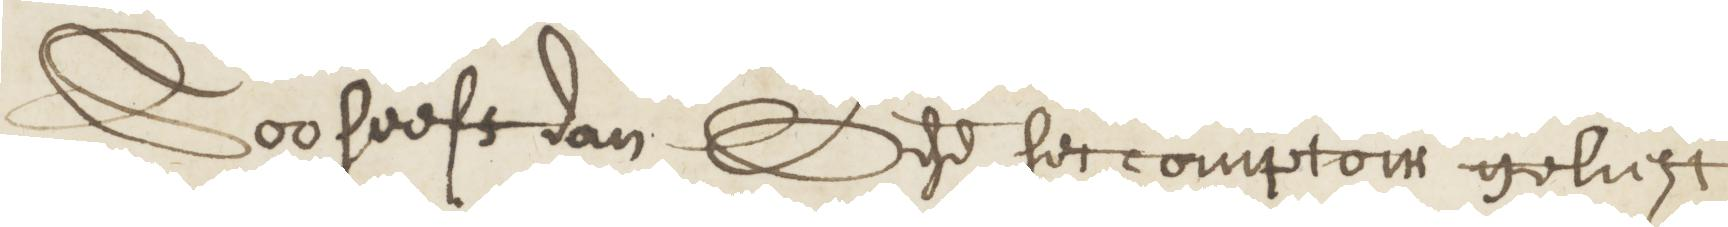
Soo heeft dan Eiss het comptoir gelicht
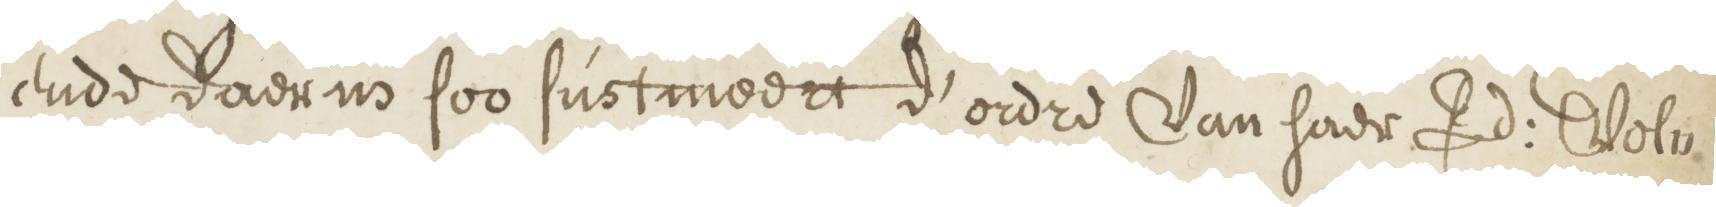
ende daer in soo sustineert d' ordre van haer Ed: vol
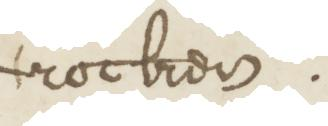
trocken.
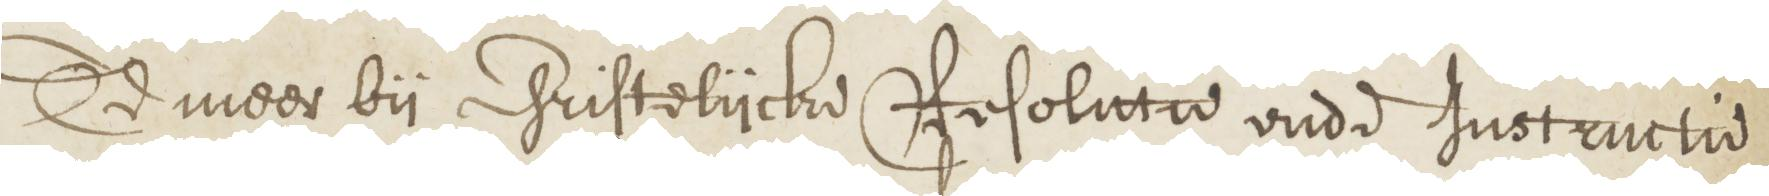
De meer bij Christelijcke Resolutie ende Jnstructie
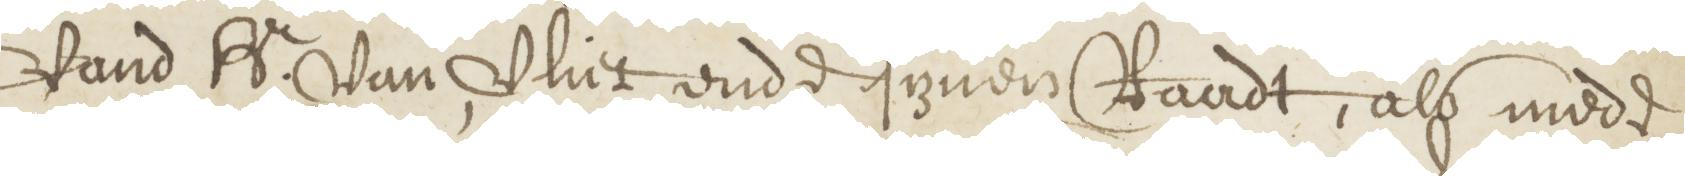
vand H.r van vliet ende synen Raadt, als mede
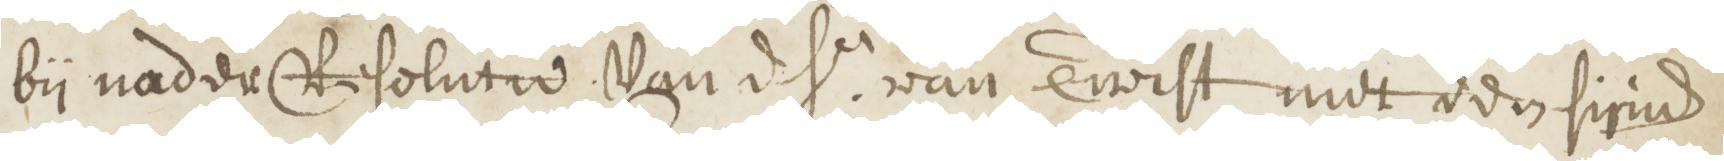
bij nader Resolutie van d h:r van werst met den sijnen
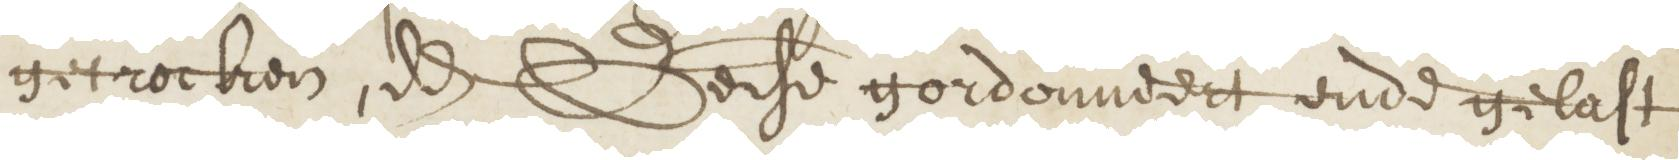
getrocken, den Eesse gordonneert ende gelast
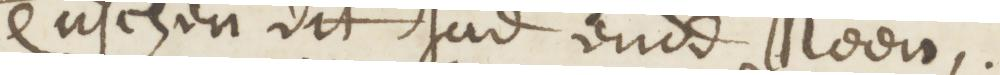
Tuschen dit Jae ende Neen,.
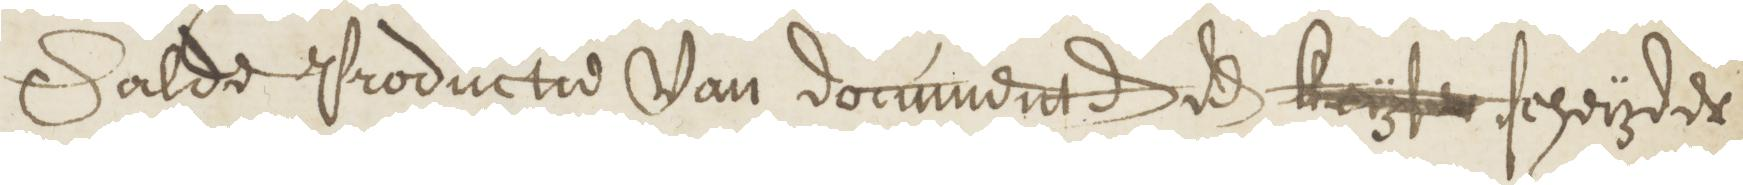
Salde productie van documenten ver keijser scheijnder
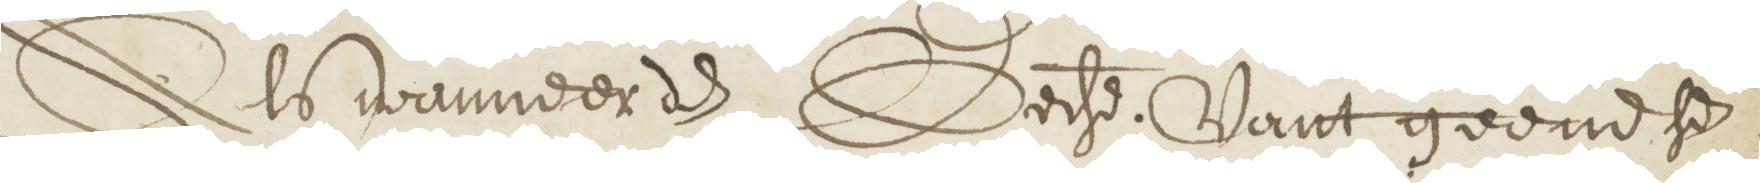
Als wanneer den Eisse Vant geenesen
